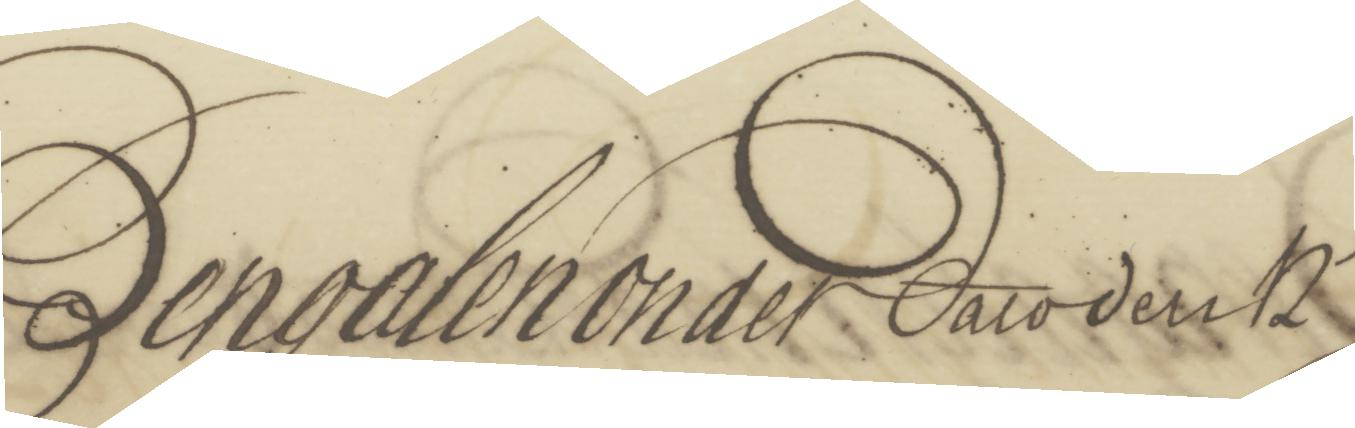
Van Bengalen onder dato den 12' Jan: 1710.
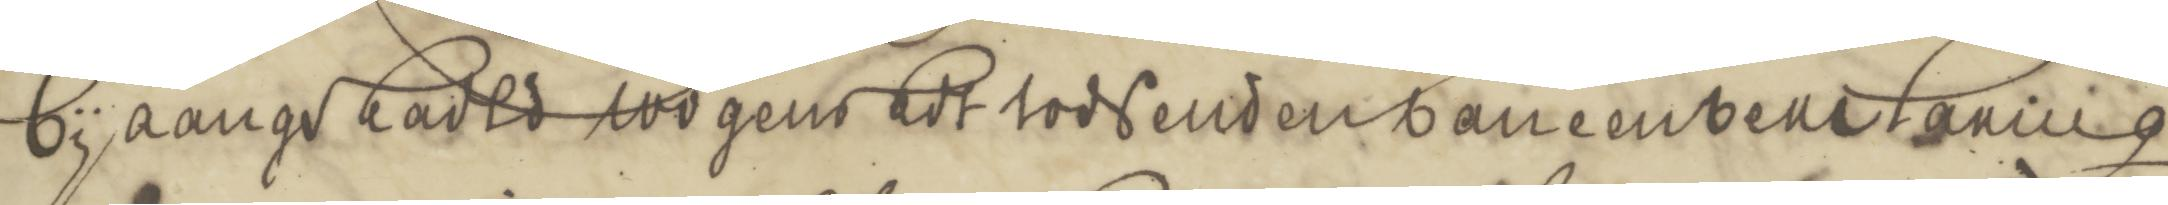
bij aangehaeld wegens het toesenden van een verclaring
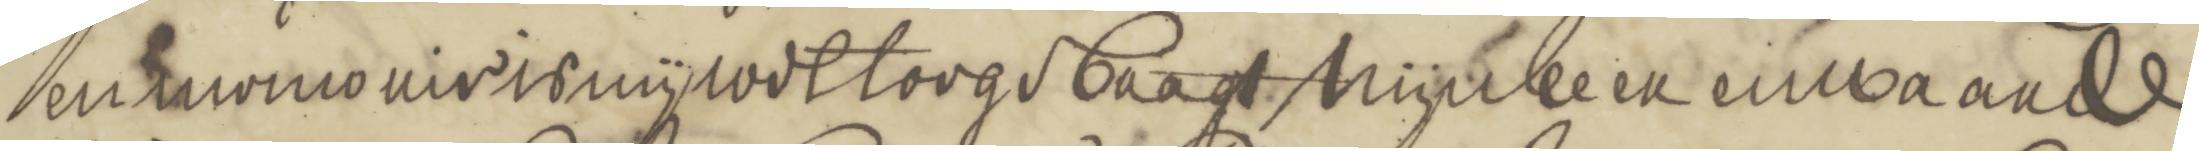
en memorie is mij wel toegebragt mijn heer en waarde
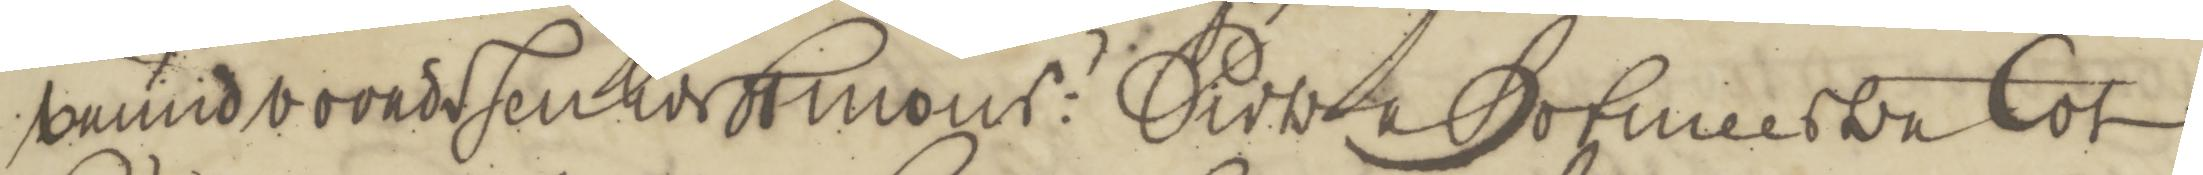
vrund voor desen heeft monr:' Pieter Hofmeester tot
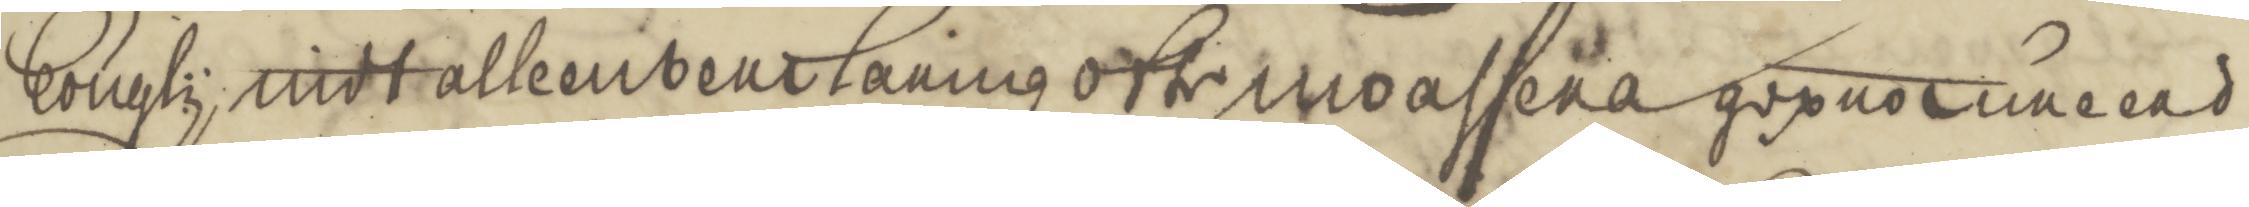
houglij, met alleen verclaring ofte moassera geprocureerd
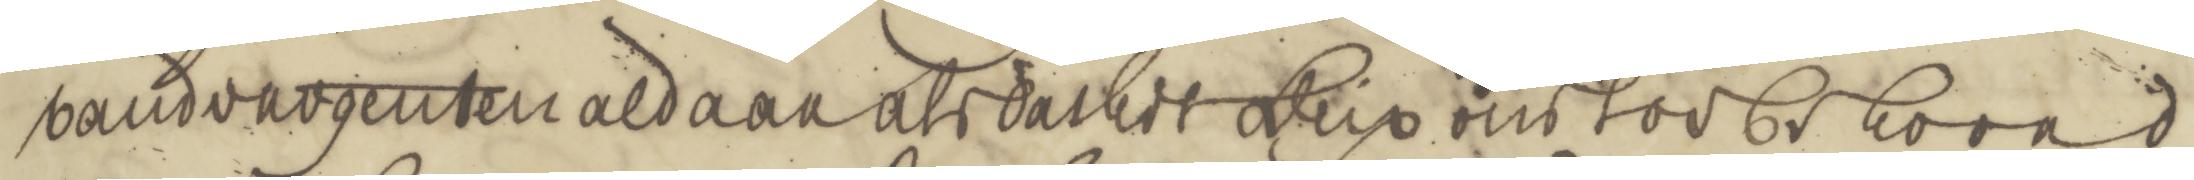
van de regenten aldaar als dat het schip ons toebehoord
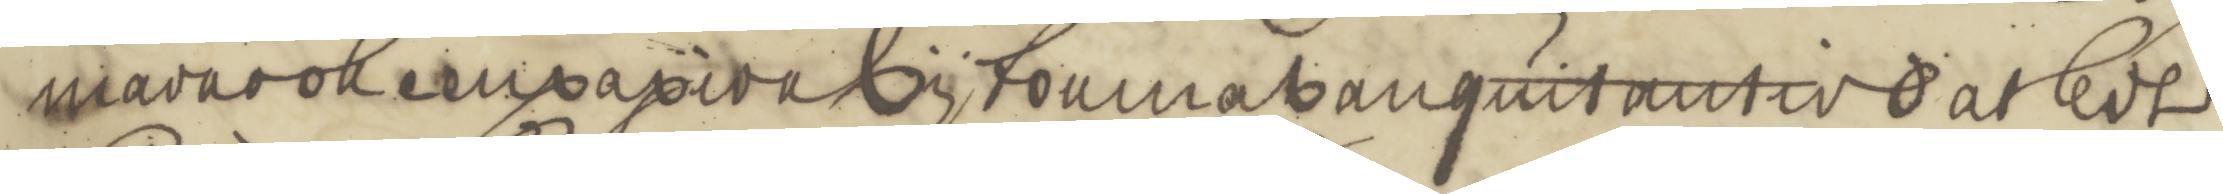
maer ook een papier bij forma van quitantie dat het
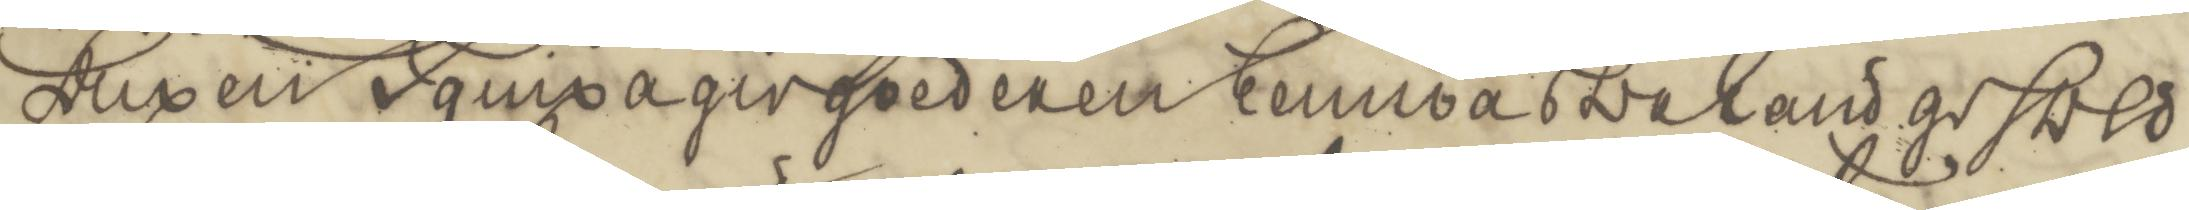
schip en Equipagie goederen hem was terhand gesteld
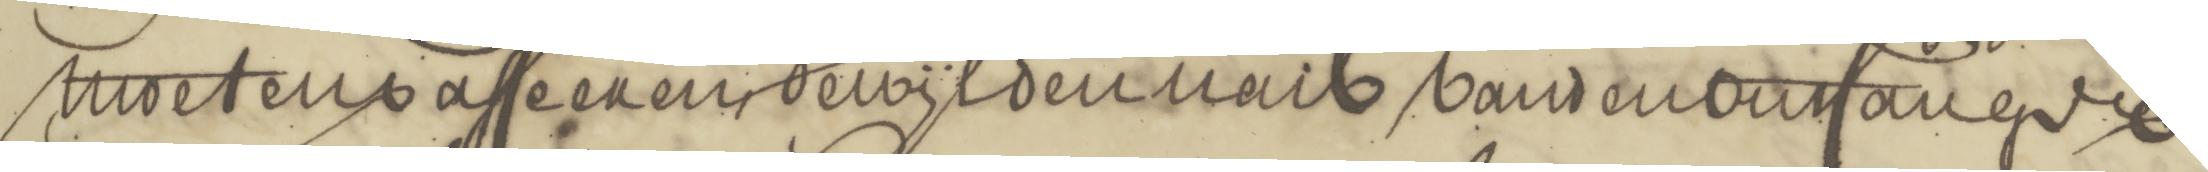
moeten passeeren, dewijl den naib van den ontfanger
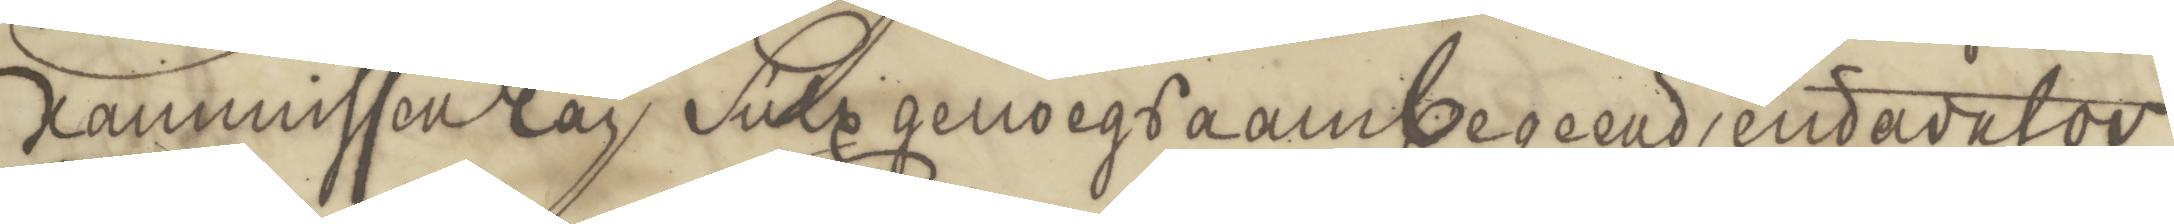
rammisser raij sulx genoegs aambegeerd, en daertoe
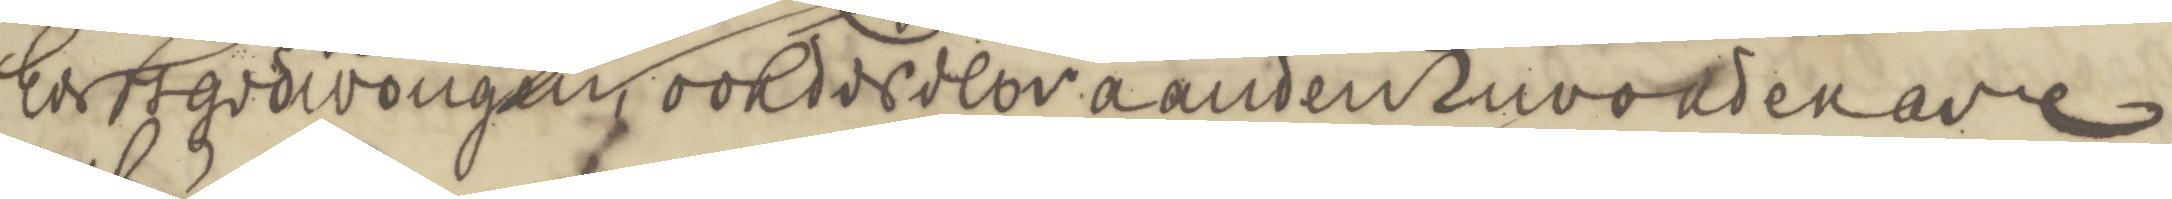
heeft gedwongen, ook deselve aan den noorder wel
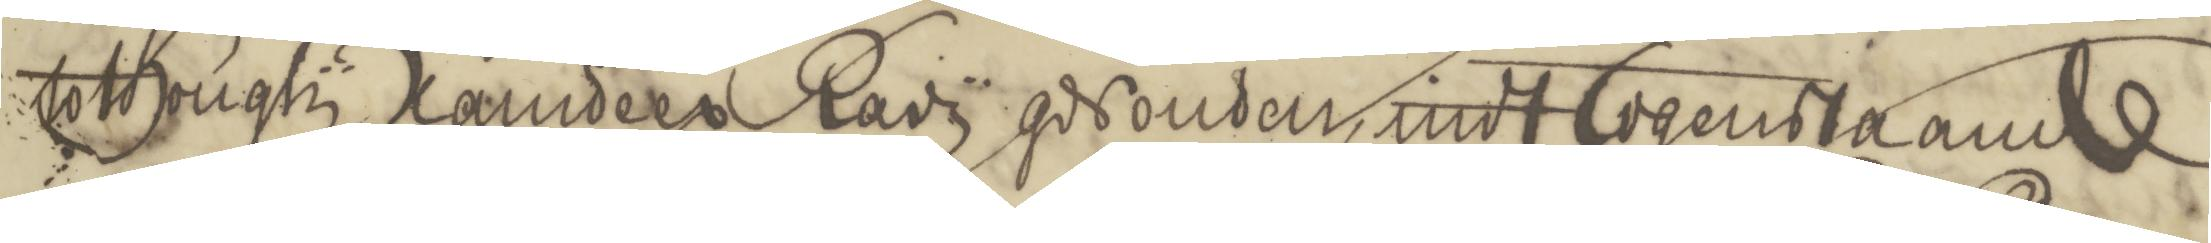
tot Houglij ramdeep Raeij gesonden, niet tegenstaande
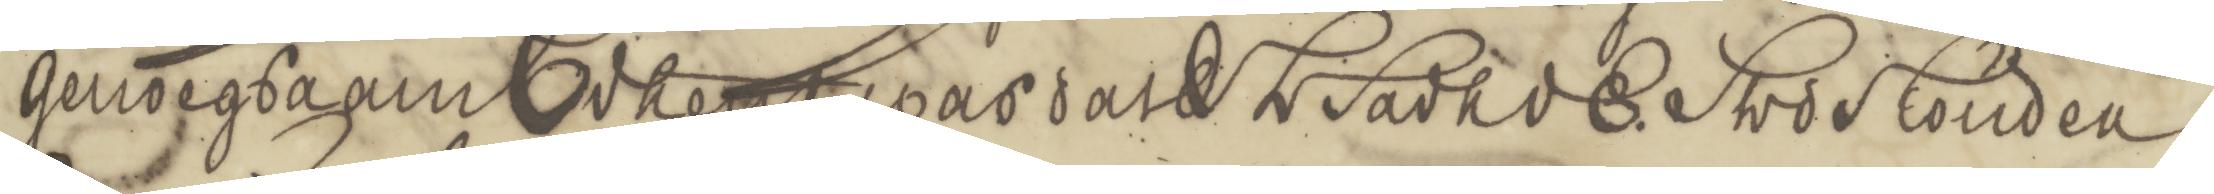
genoegsaam bekent was dat de saek dE. Stedehouder
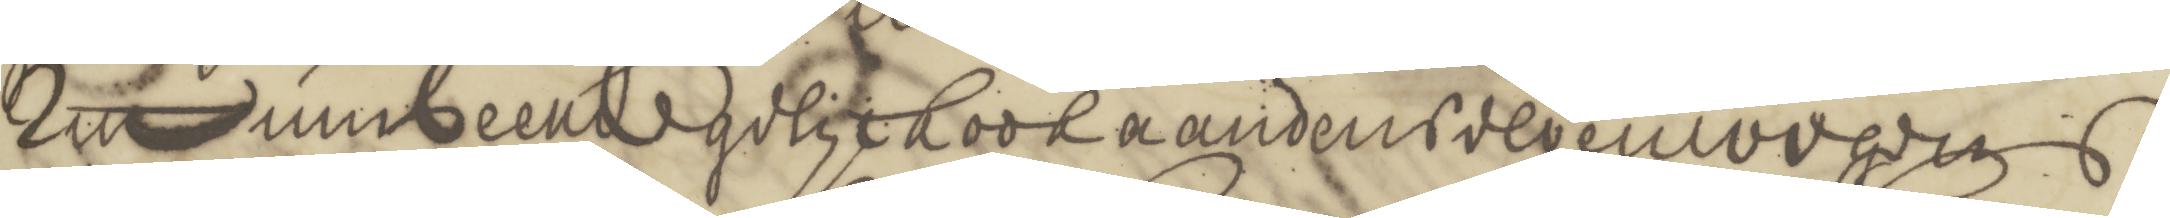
Incumbeerde gelijck ook aan denselven wegens
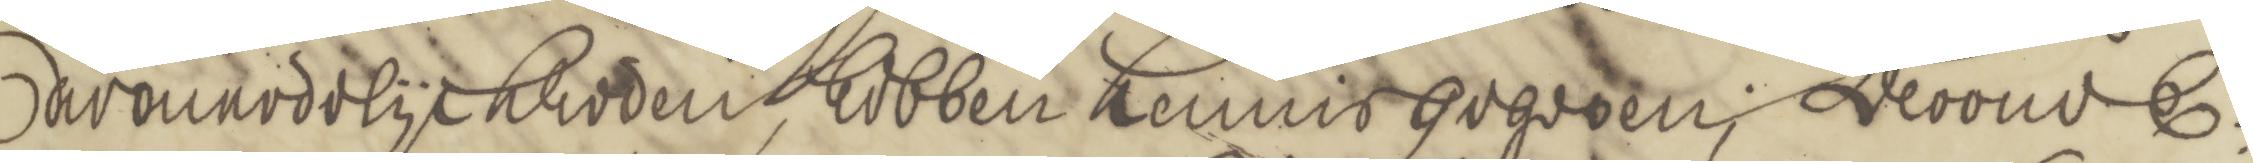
die onredelyckheden, hebben kennis gegeven; schoonelijk:
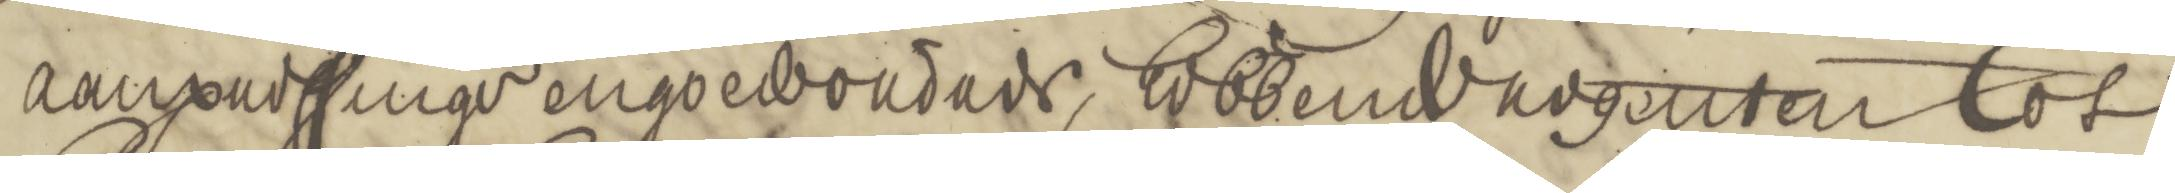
aanpressinge en goede ordres, hebbende regenten tot
